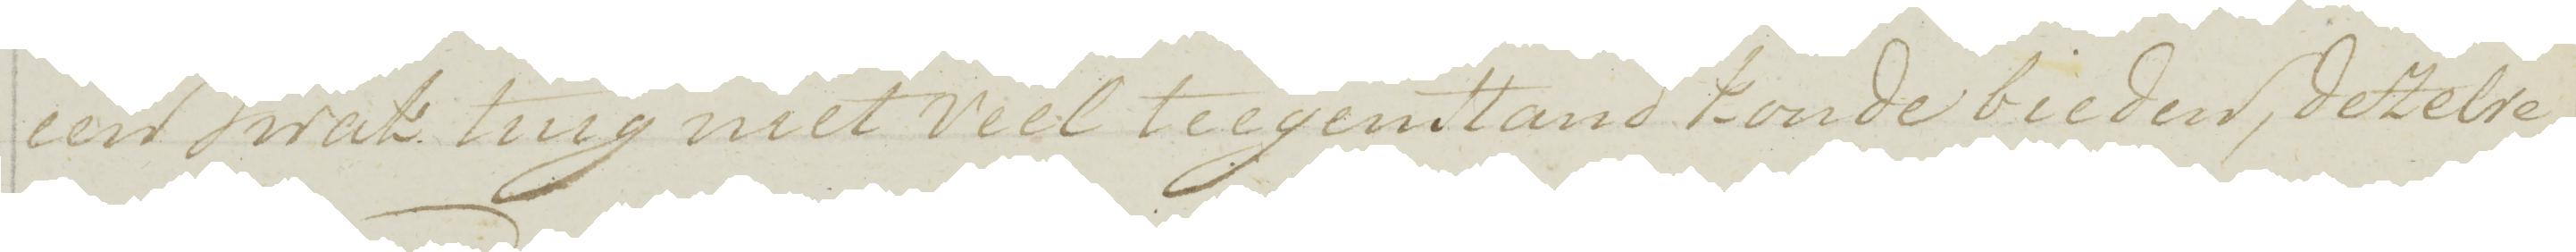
een swak tuig niet veel teegenstand konde bieden, dezelve
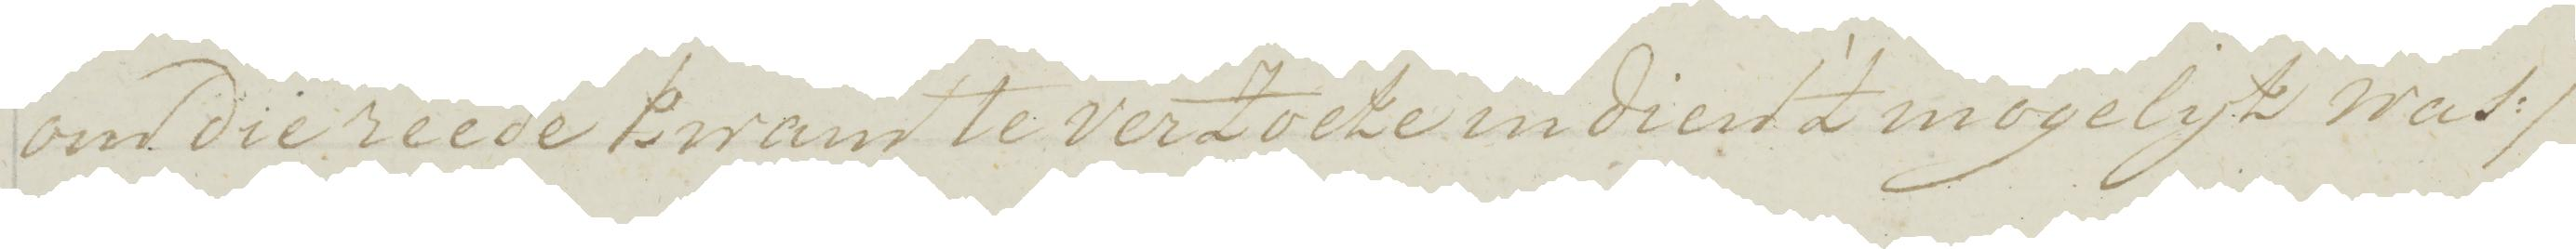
om die reede kwam te verzoeke indien 't mogelijk was:/
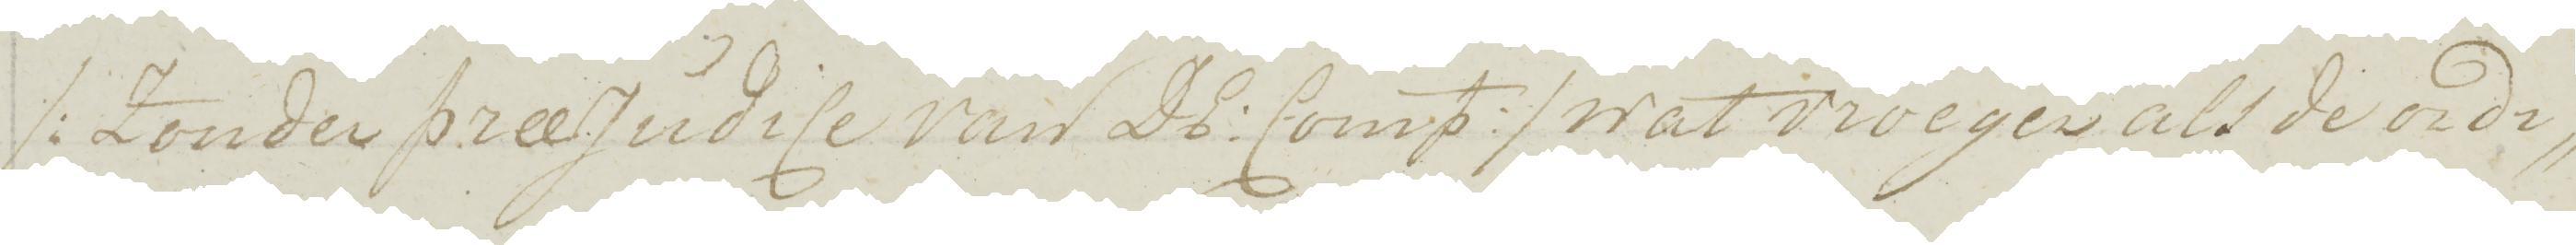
/:zonder preejudice van DE: Comp:t / wat vroeger als de ordi„
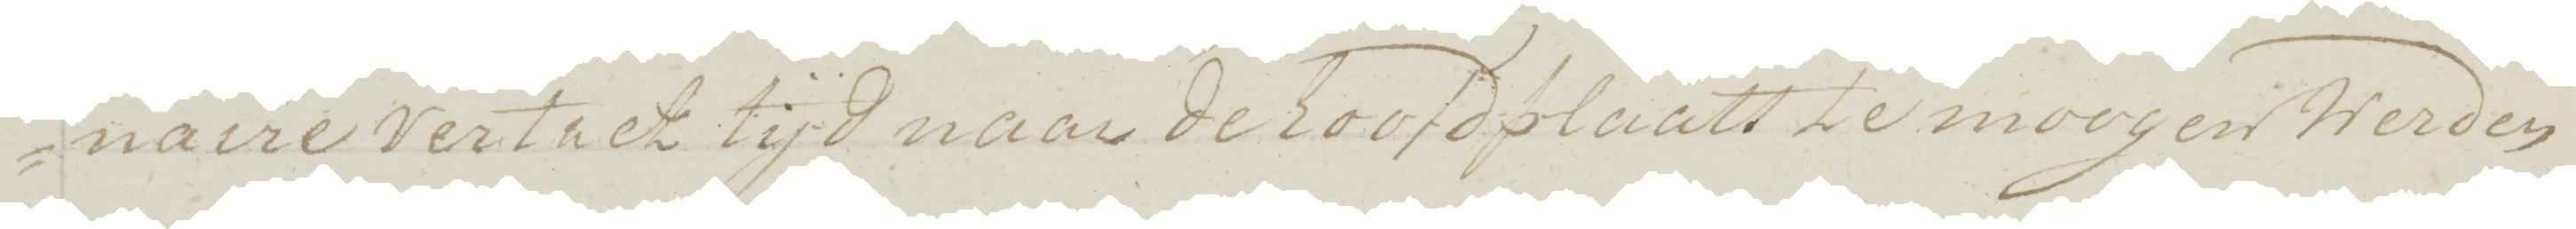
„naire vertrek tijd naar de hoofdplaats te moogen werden
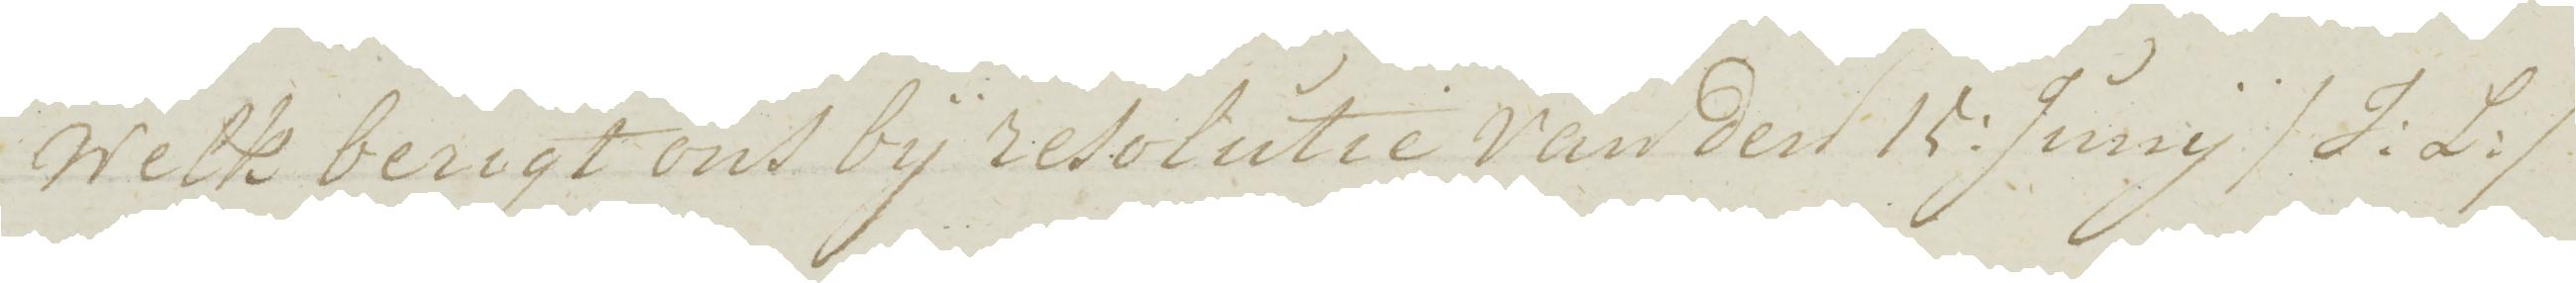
Welk berigt ons bij resolutie van den 15: Junij :/ I: L:/
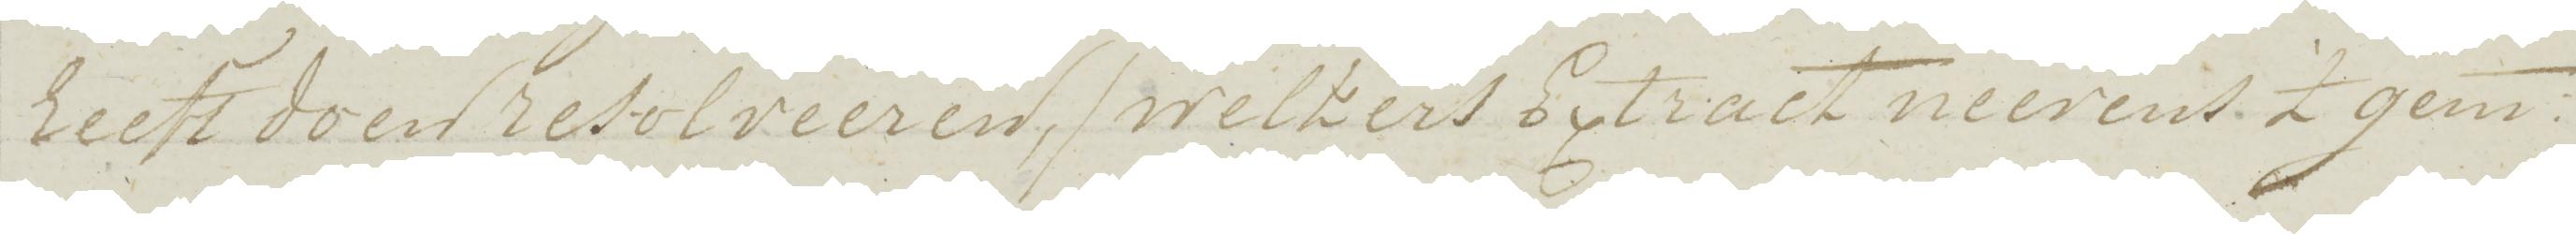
heeft doen resolveeren, / welkers Extract neevens ’t gem:
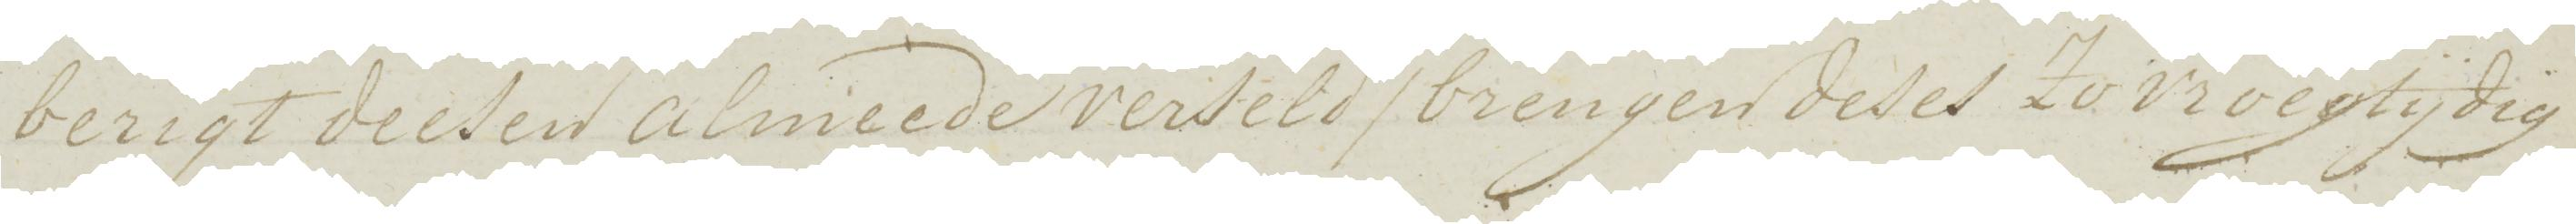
berigt deesen almeede verseld / brengen deses zo vroegtijdig
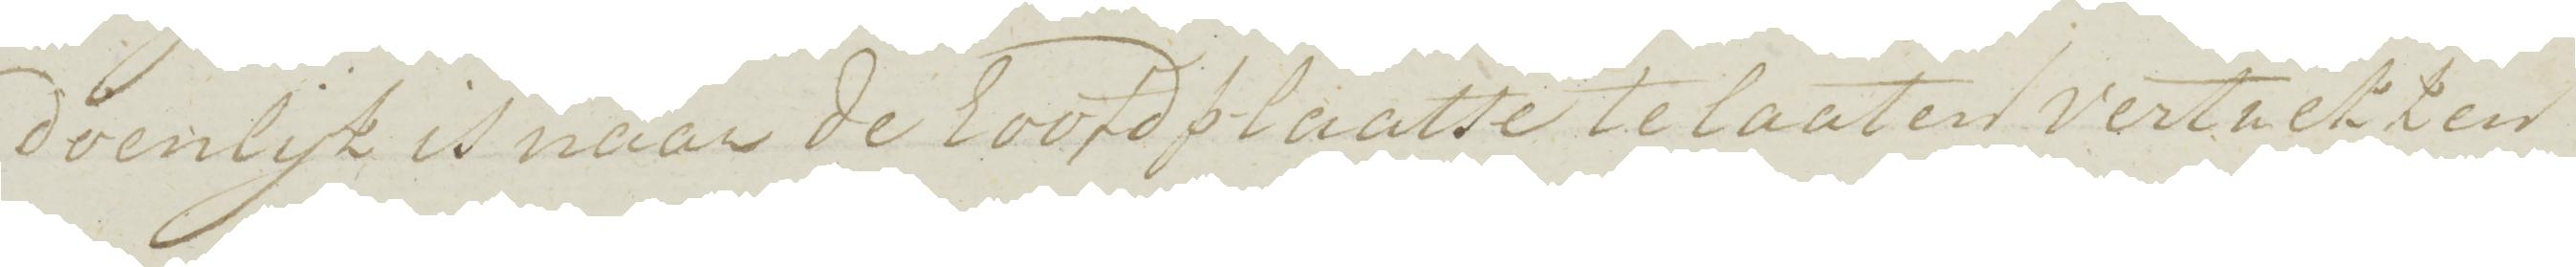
doenlijk is naar de hoofdplaatse te laaten vertrekken
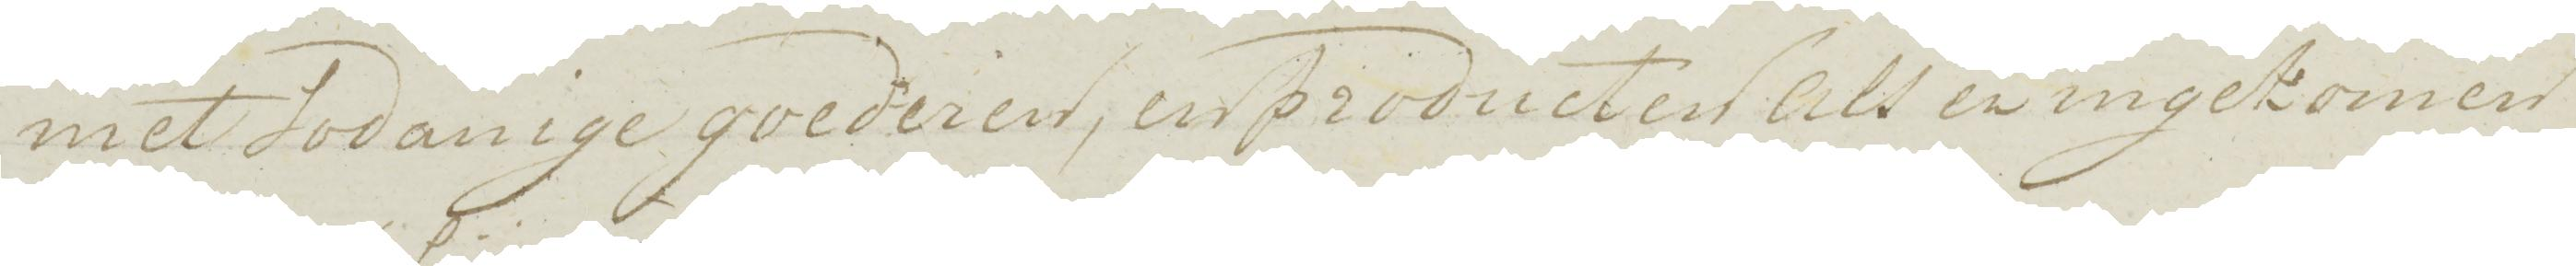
met sodanige goederen, en producten als er ingekomen
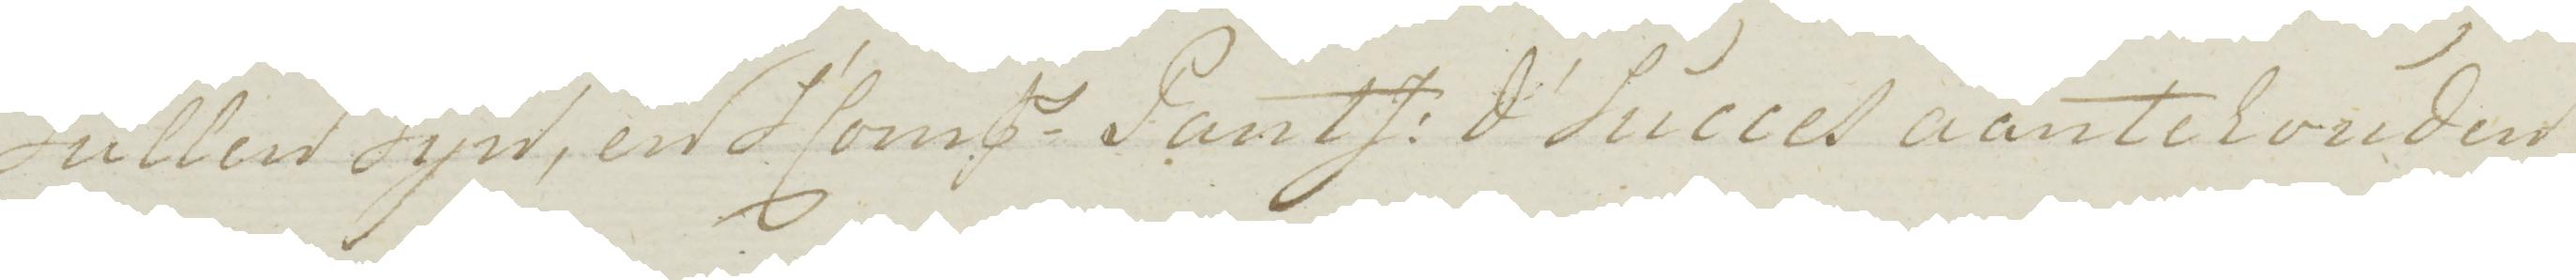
sullen sijn, en ’s Comp=s Pantj: d’ succes aan tehouden
